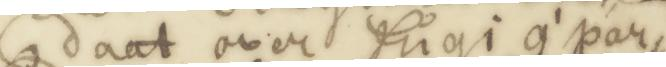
daat over fugi g’par„
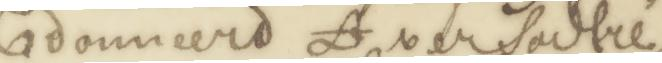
donneerd te versoeke
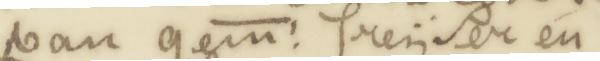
van gem: sreijser en
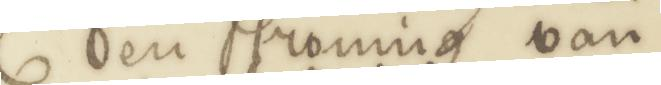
den koning van
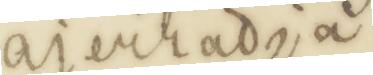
ajerhadja
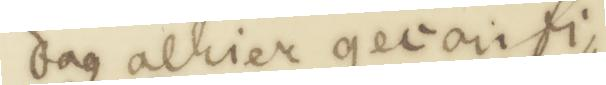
dog alhier geconfi„
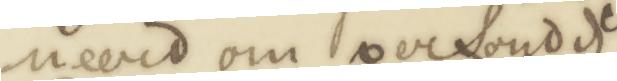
neerd om versonden
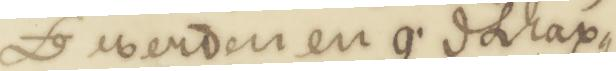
te werden en g’ eschap„
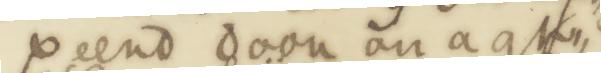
peerd door on agt„
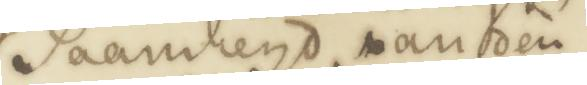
saamheijd van den
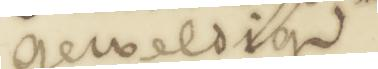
geweldige
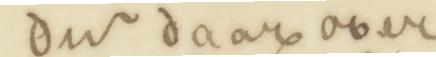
die daar over
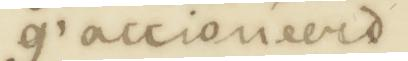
g’accioneerd
